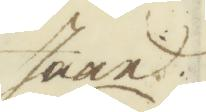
Jaar .
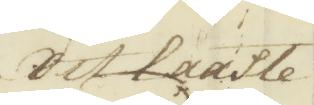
dit Laaste
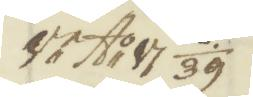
v„r A„o 1738:39
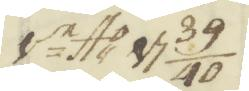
v=r A„o 1739/40
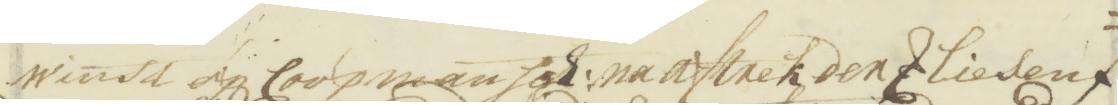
winst on Coopmansch: na aftrek der verliesen
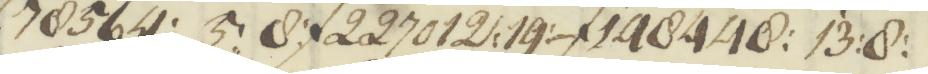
ƒ78564: 5: 8:ƒ227012:19:—ƒ148448:13:8:
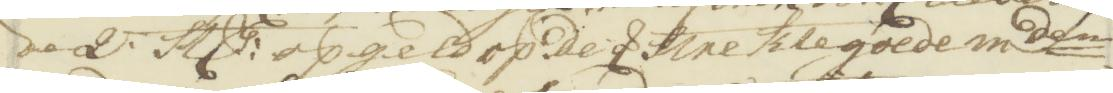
de 2: stver:s op geld op de verstrekte goede m=den
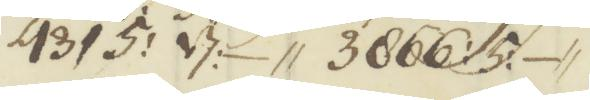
4315: 17:— „ 3866:15:—„
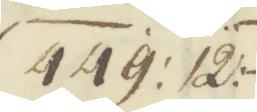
449: 12:
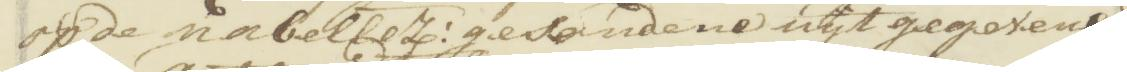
op de nabellez: gesondene uijt gegevene
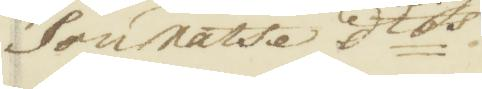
Souratse d=tos
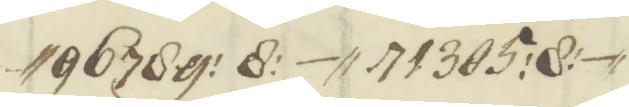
„96789: 8: —„ 7135:8:—
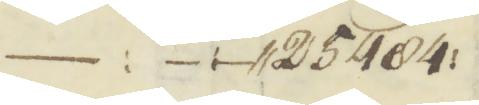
— : —:—„25484:
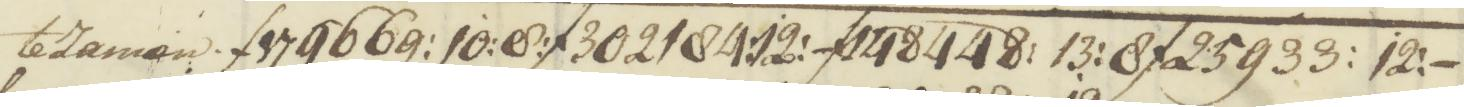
te zamen - ƒ179669: 10: 8: ƒ30218412: ƒ148448: 13: 8ƒ25933: 12:–
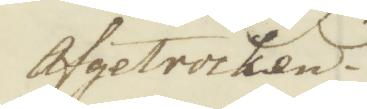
afgetrocken -
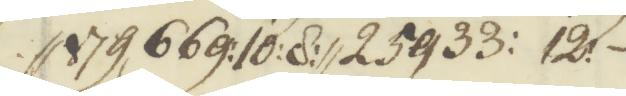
„179669:10:8:„25933: 12:—
